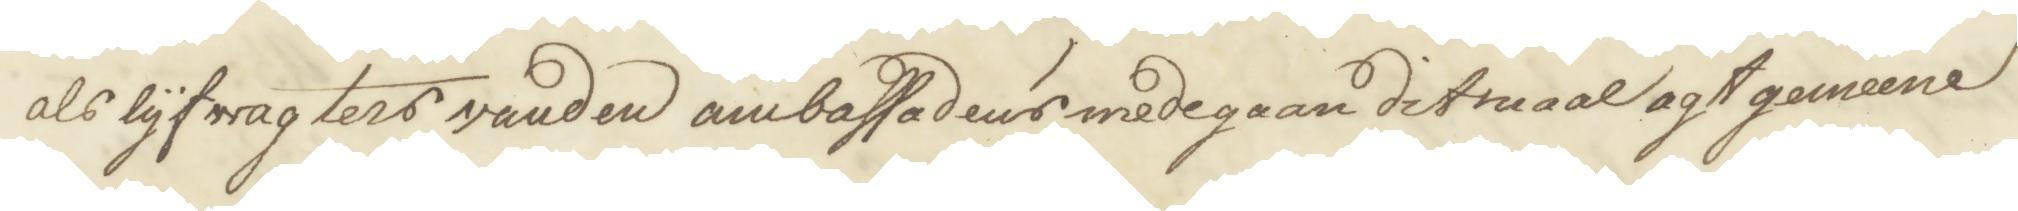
als lijfwagters vanden ambassadeur mede gaan ditmaal agt gemeene
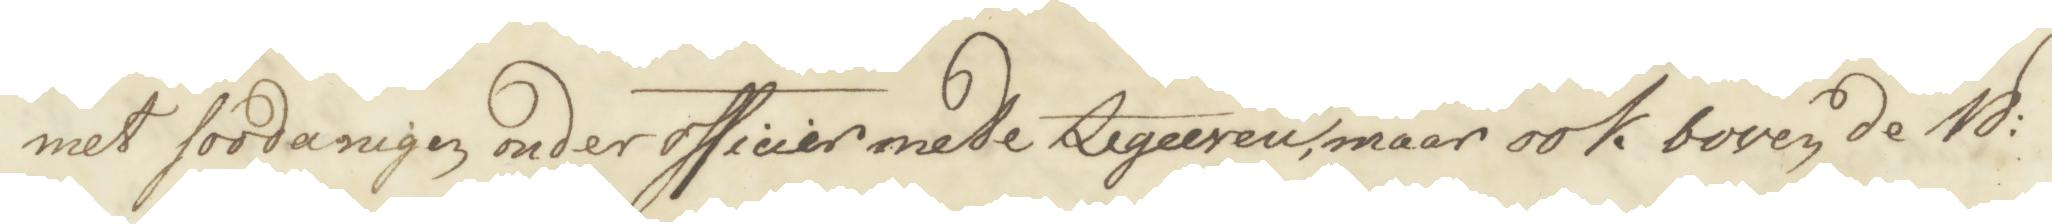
met soodanigen onder officier mede Regeeren, maar ook boven de 18:
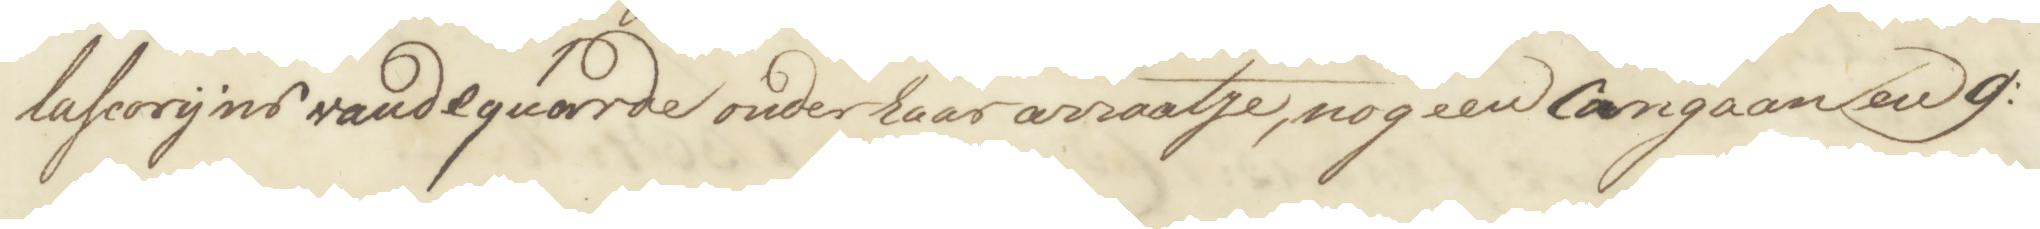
lascorijns vande guarde onder haar arraatje, nog een Cangaan en 9:
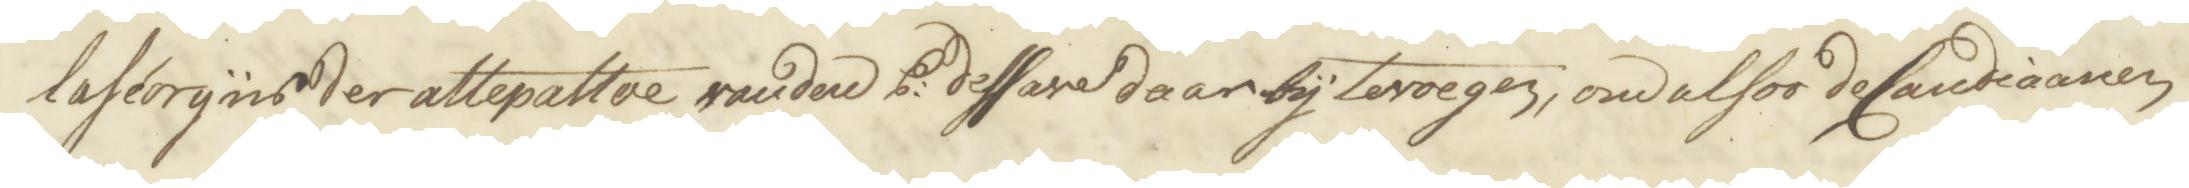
lascorijns der attepattoe van den E: dessave daar bij tevoegen, om alsoo de Candiaanen
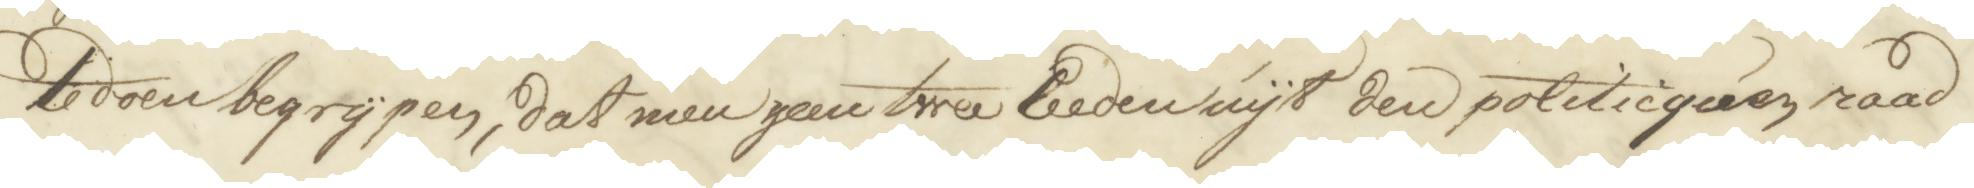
te doen begrijpen, dat men geen twee leeden uijt den politicquen raad
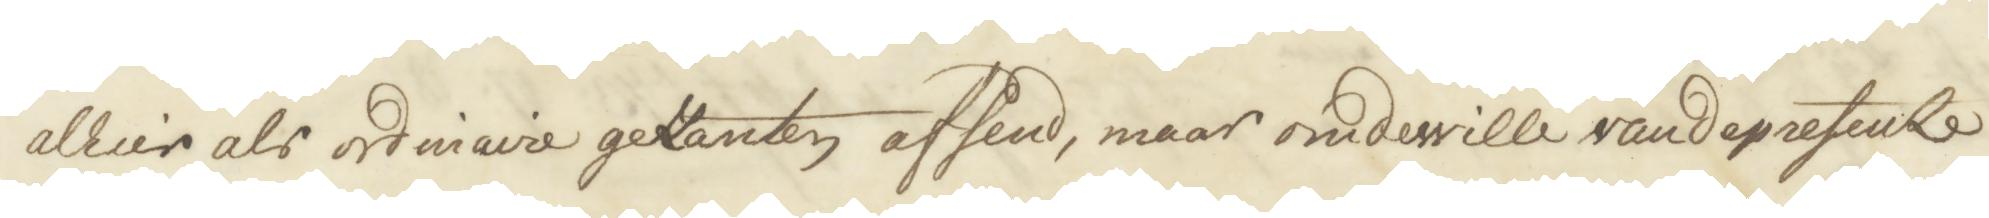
alhier als ordinaire gezanten afsend, maar om dewille van de presente
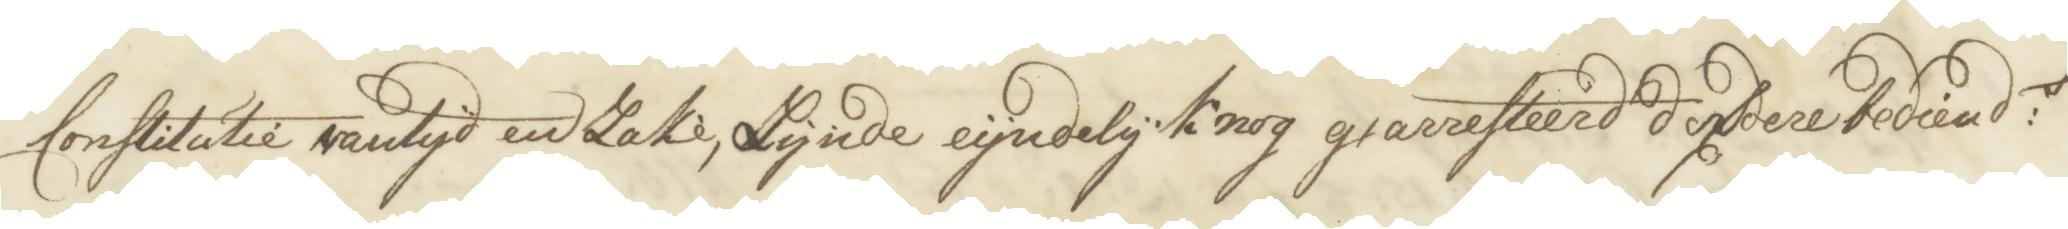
Constitutie van tijd en zake, zijnde eijndelijk nog g'arresteerd deverdere bediend:s
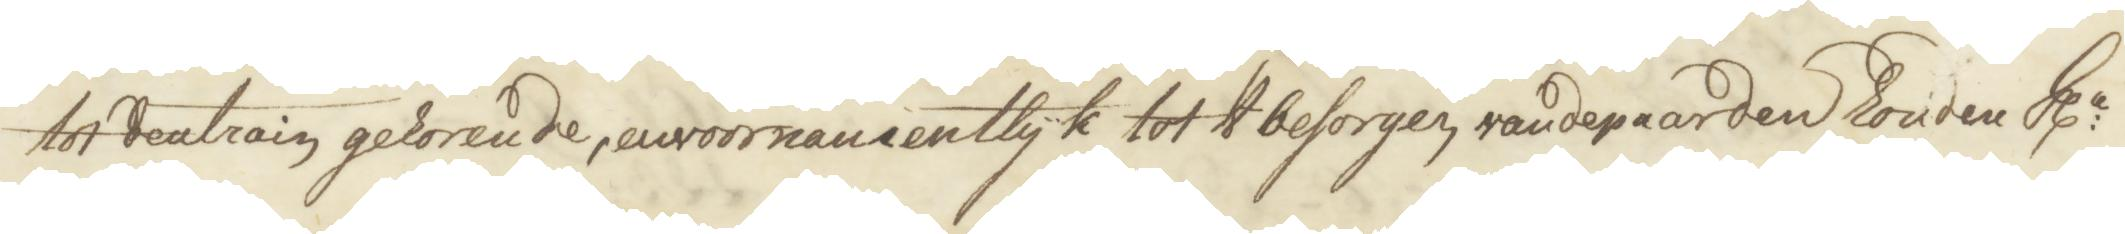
tot den train gehorende, en voornamentlijk tot 't besorgen van de paarden houden &c:a
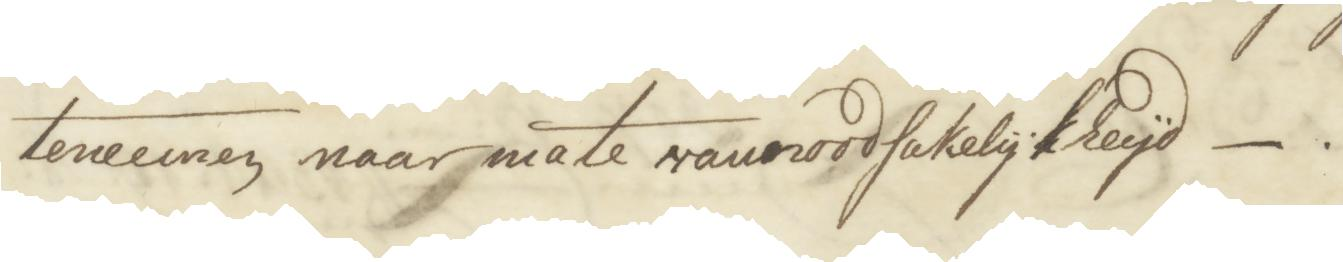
teneemen naar mate van noodsakelijkheijd —.
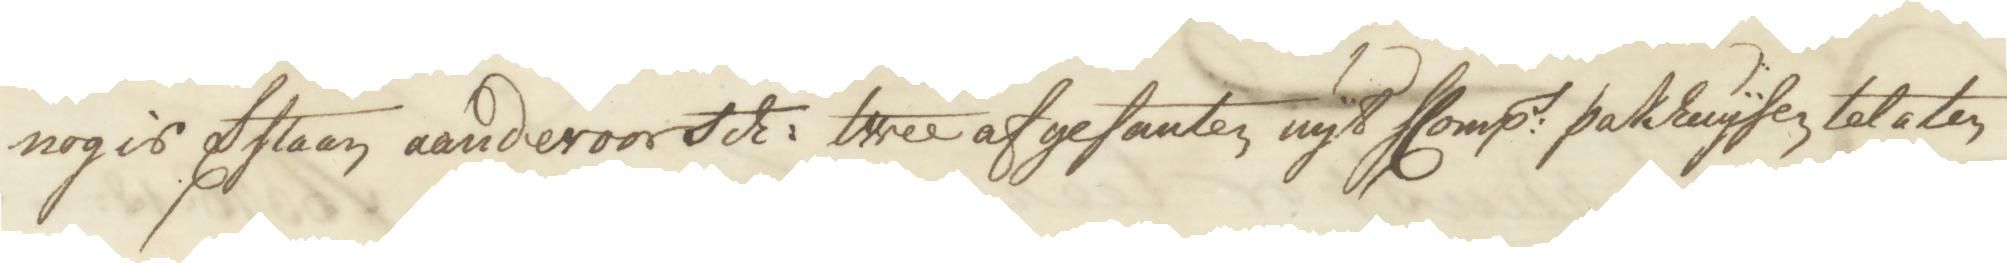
nog is verstaan aan devoorsch: twee afgesanten uijt sComp:s pakhuijsen telaten
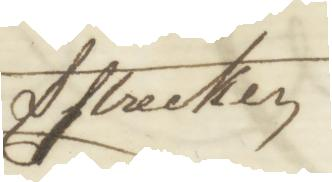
verstrecken
